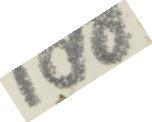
188
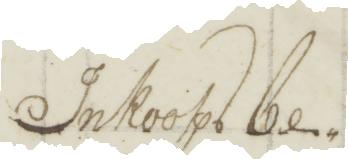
Inkoops be„
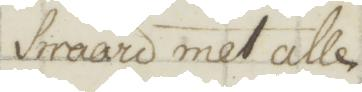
swaard met alle
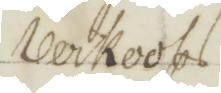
verkoops
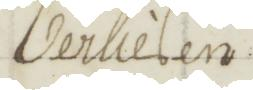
Verliesen
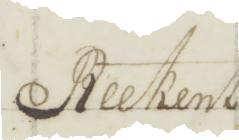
Reekent
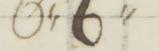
P„rC„o
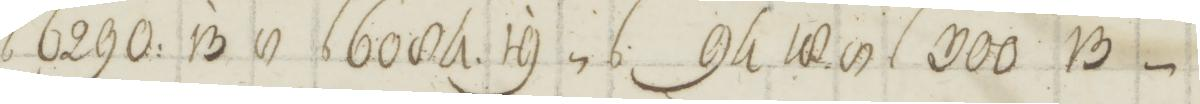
6290: 13 8 ƒ6084. 19 –ƒ 94 18. 8 ƒ 300 13 —
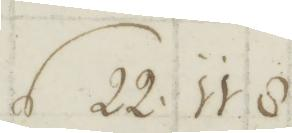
ƒ 22: 11. 8
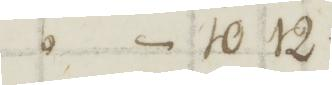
ƒ – 10 12
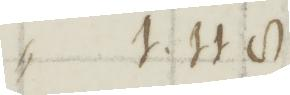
„ 1. 11 8
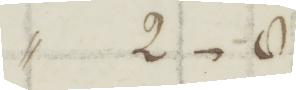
„ 2 – 8
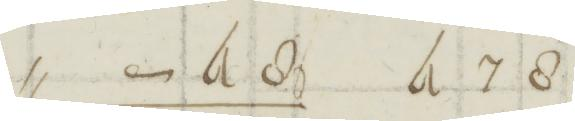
„ – 4 8ƒ 4 7 8
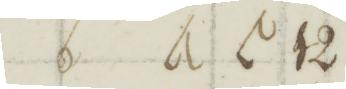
ƒ 4 5 12
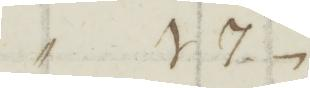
„ 1 7 —
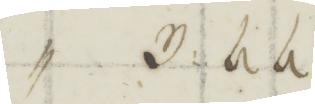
„ 3: 4 4
